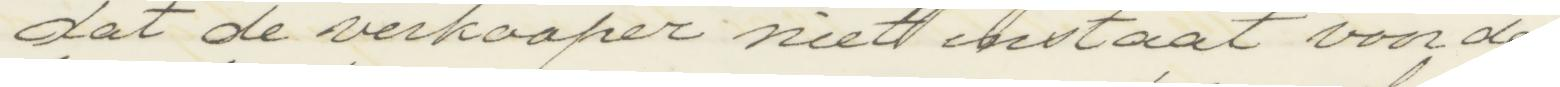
dat de verkooper niet instaat voor de
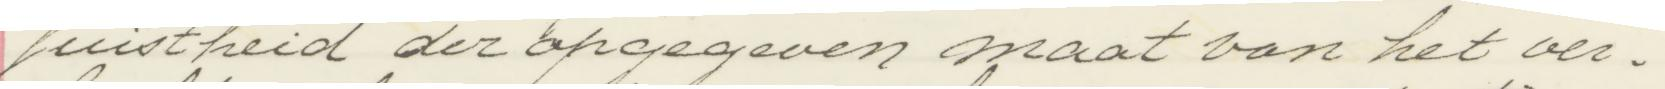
juistheid der opgegeven maat van het ver-
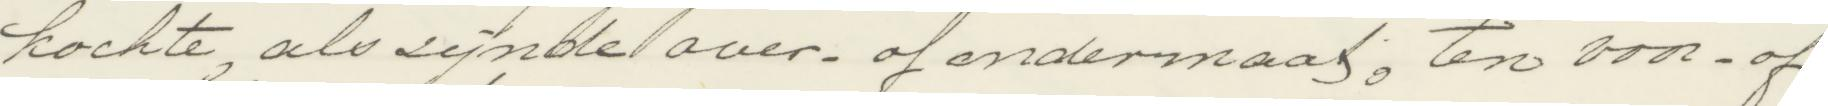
kochte, als zijnde over - of ondermaat, ten voor - of
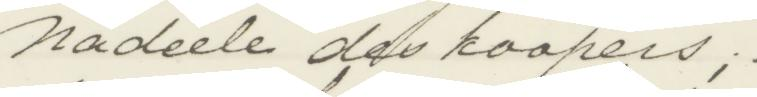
nadeele des koopers;
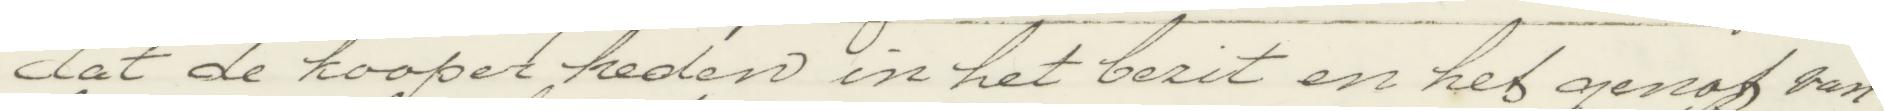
dat de kooper heden in het bezit en het genot van
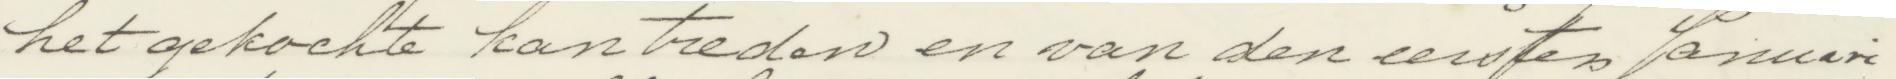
het gekochte kan treden en van den eersten Januari
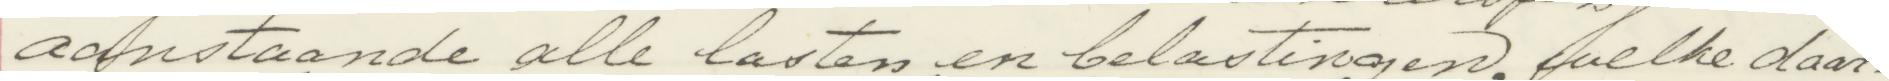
aanstaande alle lasten en belastingen, welke daar
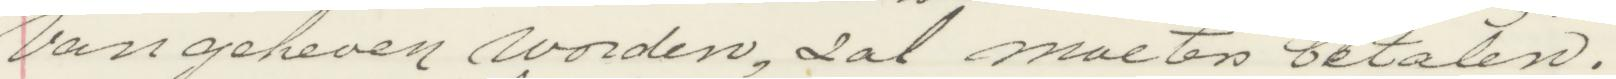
van geheven worden, zal moeten betalen;
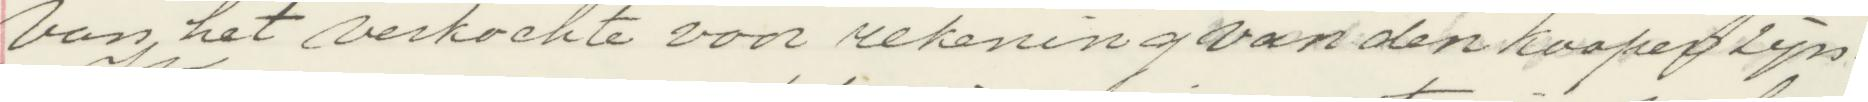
van het verkochte voor rekening van den kooper zijn.
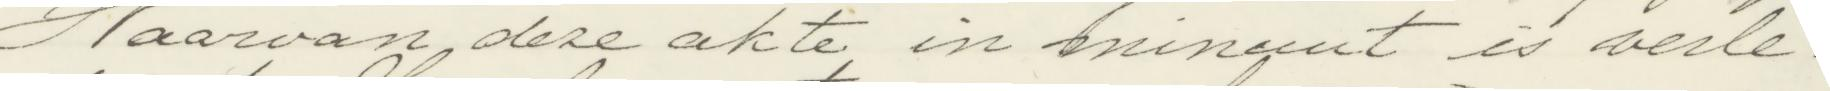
Waarvan deze akte in minuut is verle
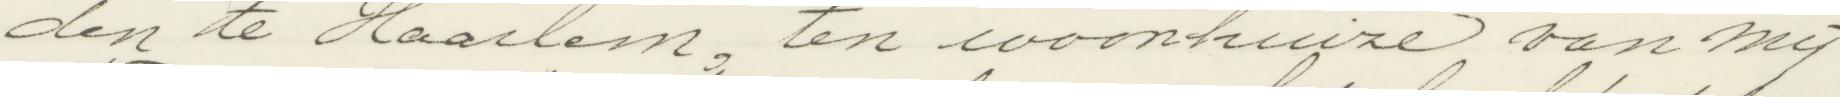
den te Haarlem ten woonhuize van mij
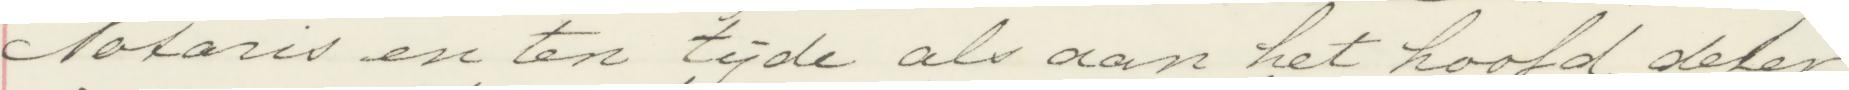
Notaris en ten tijde als aan het hoofd dezer
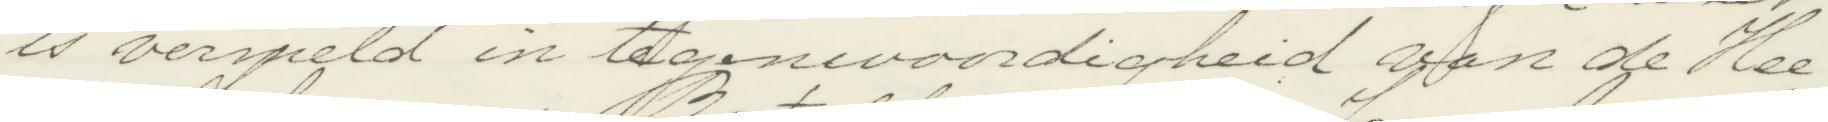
is vermeld in tegenwoordigheid van de Hee
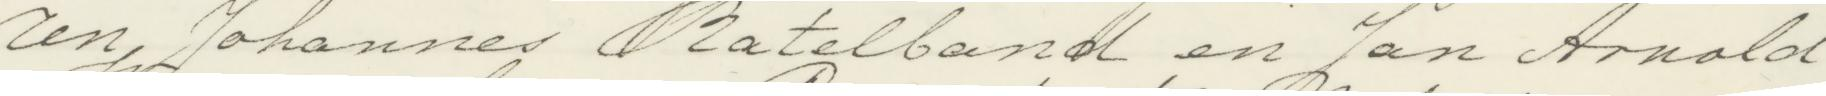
ren, Johannes Ratelband en Jan Arnold
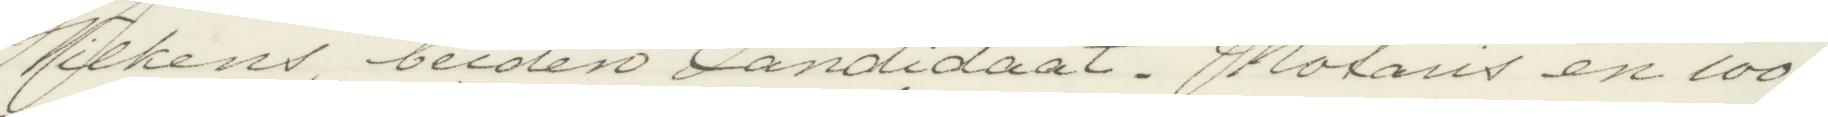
Wilkens, beiden Candidaat - Notaris en wo-
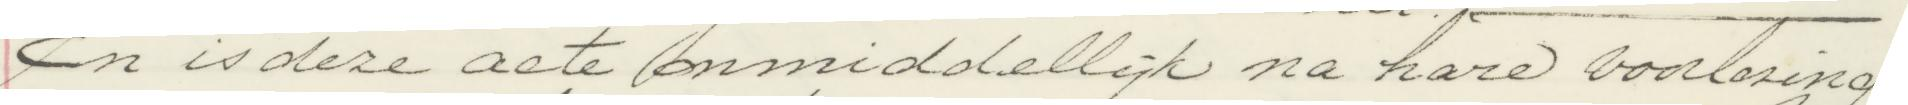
En is deze acte onmiddellijk na hare voorlezing
